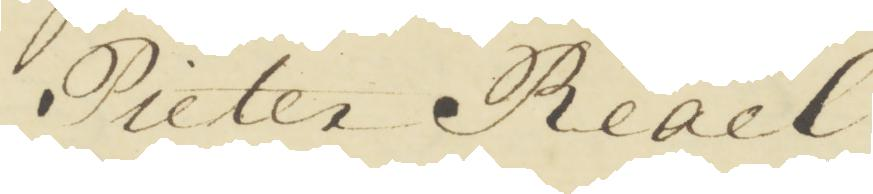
Pieter Reael
